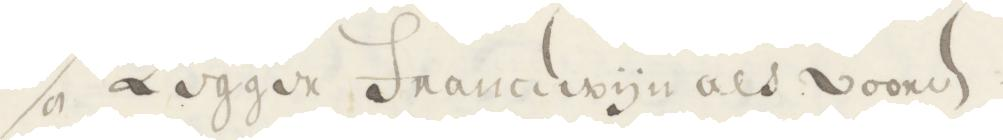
¾ Legger, Francewijn als vooren
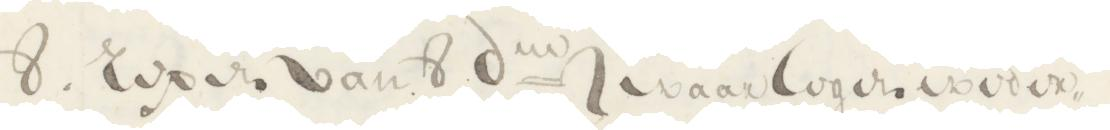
8. repen van 8 d=m waartegen weder„
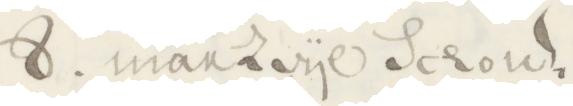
8. marzeijl Schone„
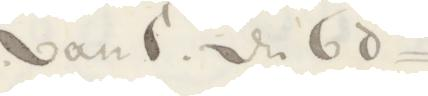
van 5. en 6 d=m
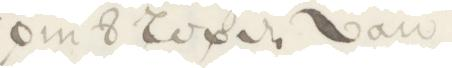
om 8 repen van
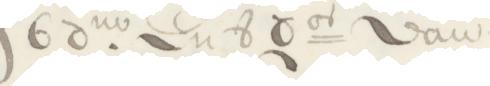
6 d.m en 8 d=os van
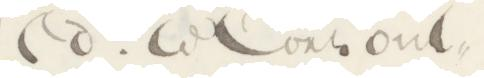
5 d.m te Corhont„
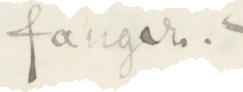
fangen.
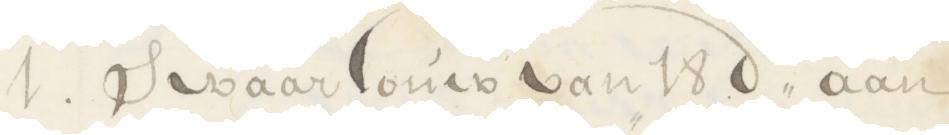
1. Swaar touw van 18 d„m aan
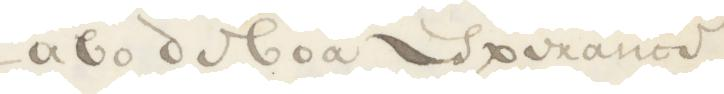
abo de boa sperance
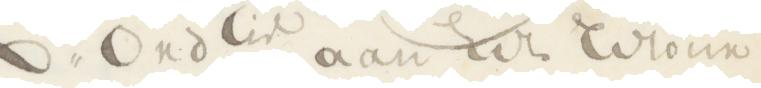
p„ ordtie aan het retour
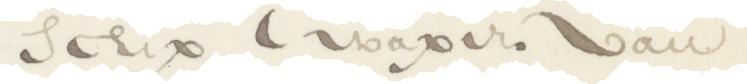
schip ’t wapen van
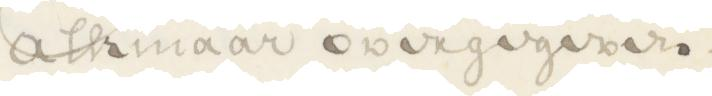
Alkmaar overgegeven.
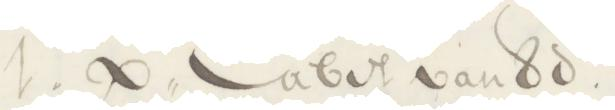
1 p„ cabel van 8 d„m
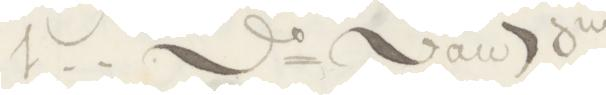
1 D=o van 1 d„m
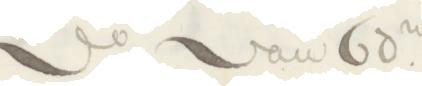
D=o van 6 d„m
